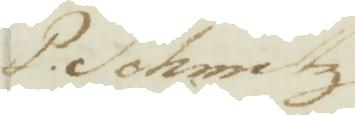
P. Schmitz
